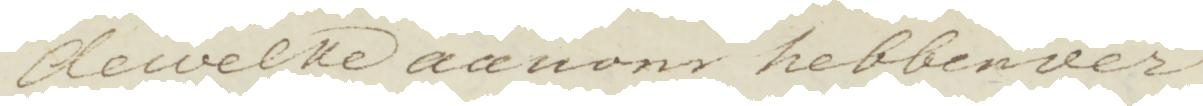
dewelke aan ons hebben ver
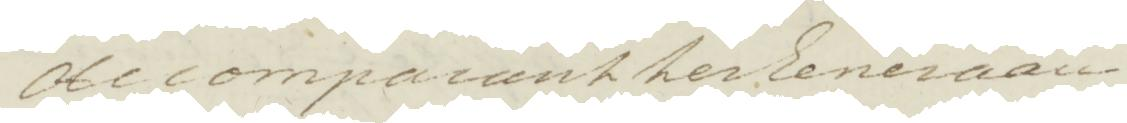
de comparant ter Eener aan
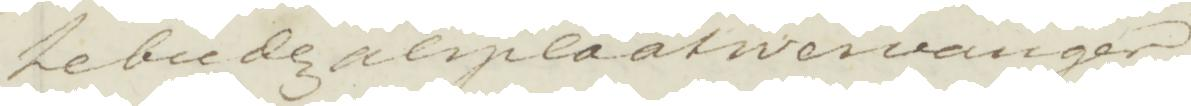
tebieden als plaatsvervanger
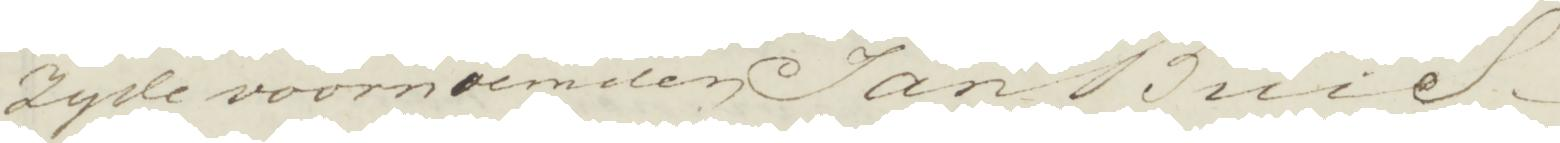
zyde voornoemden Jan Buis —
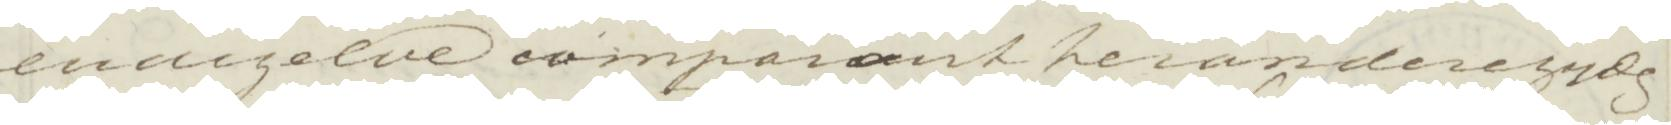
en dezelve comparant terandere zyde
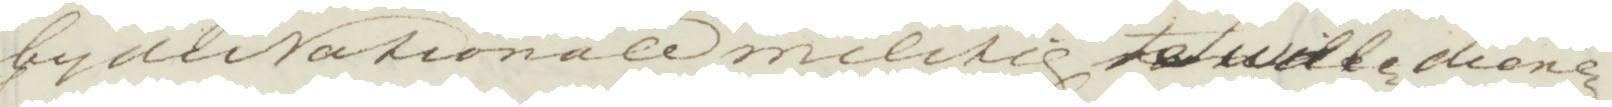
by de Nationale militie te willen dienen
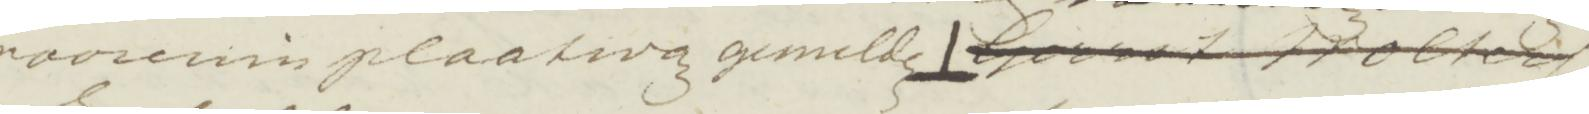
voor en in plaats van gemelden ¶ Gerrit Wolkers
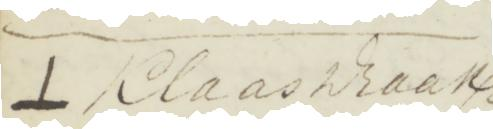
¶ Klaas Draak
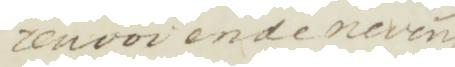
renvoi ende nevens
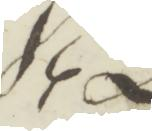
K D
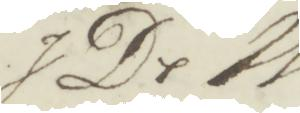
J De W
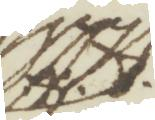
A.H
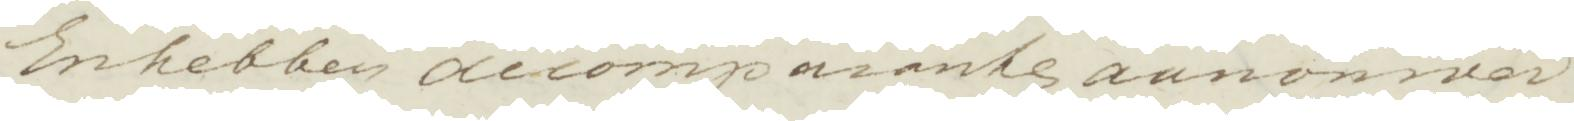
En hebben de comparanten aan ons ver
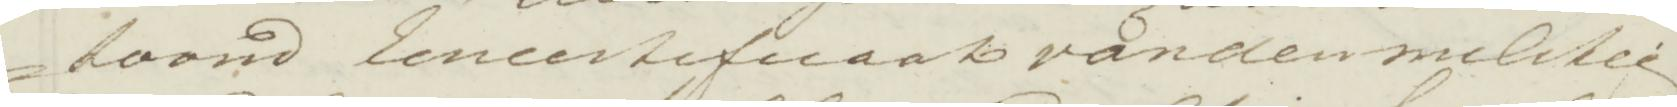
=toond Een certificaat van den militie
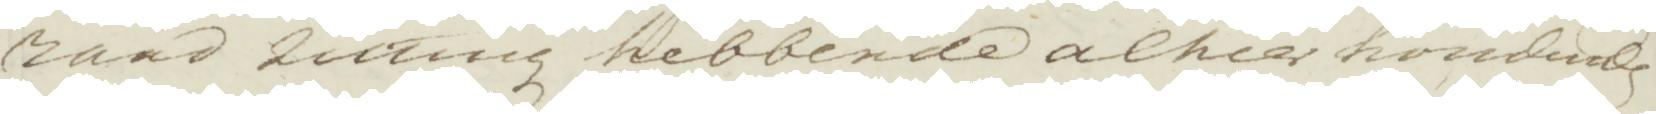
raad zitting hebbende alhier houdenden
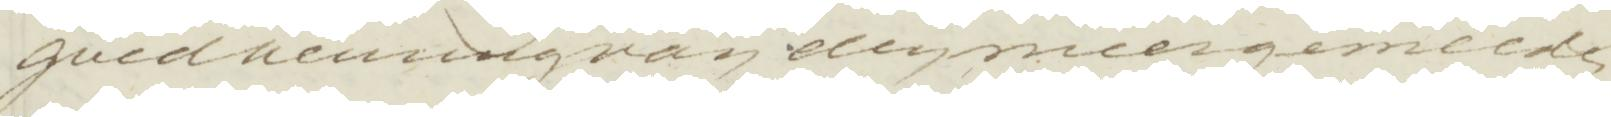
goedkeuring van den meergemelden
